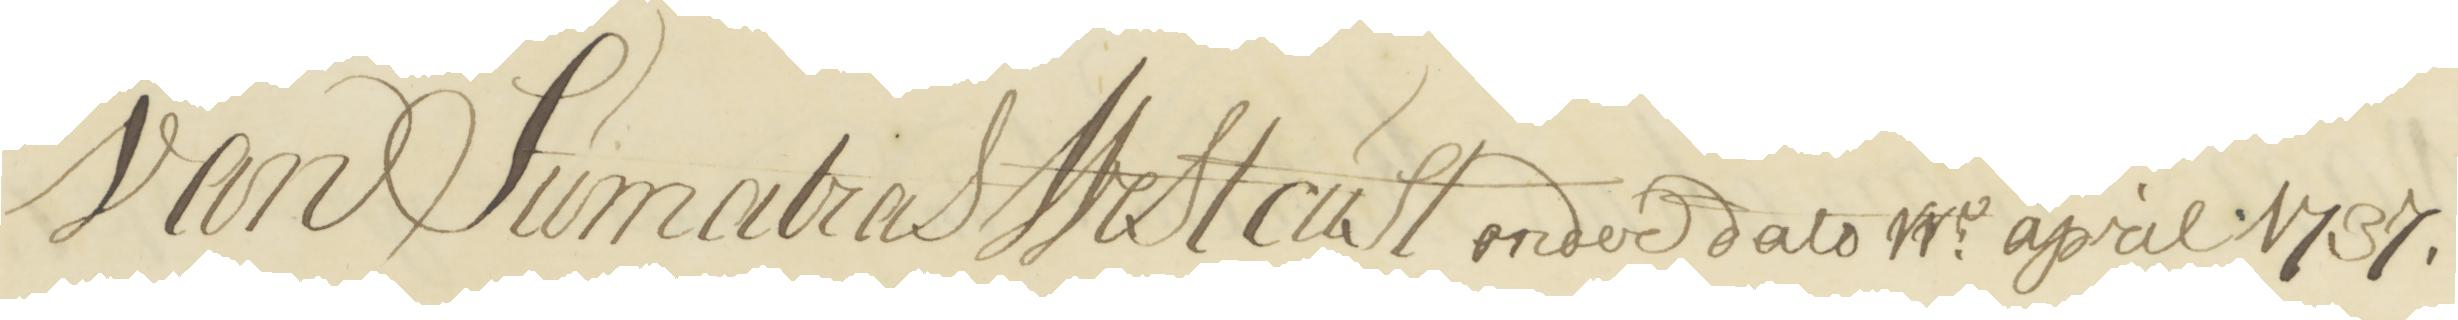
Van Sumatras West cust onder dato 11:e april 1737.
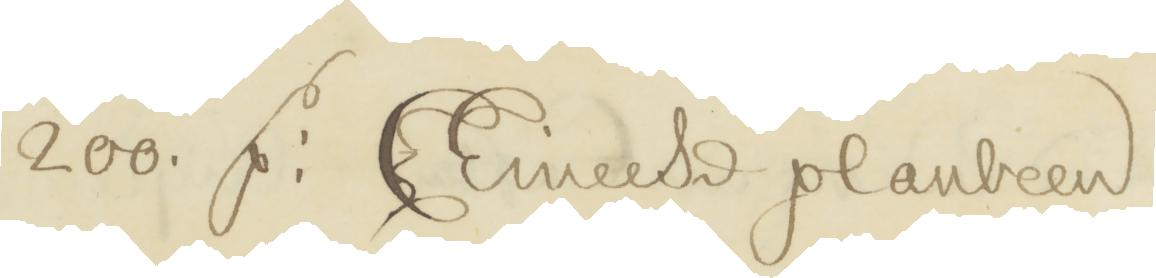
200. p:s Chineese planken
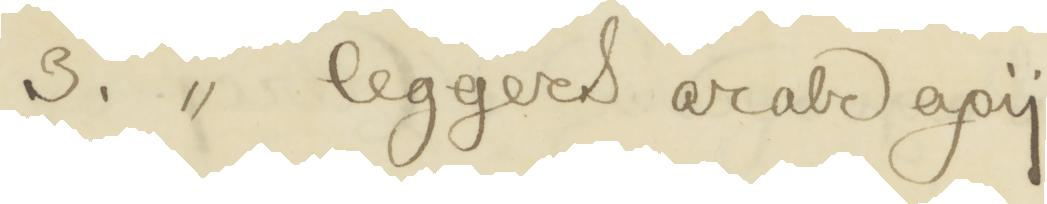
3. „ leggers arak apij
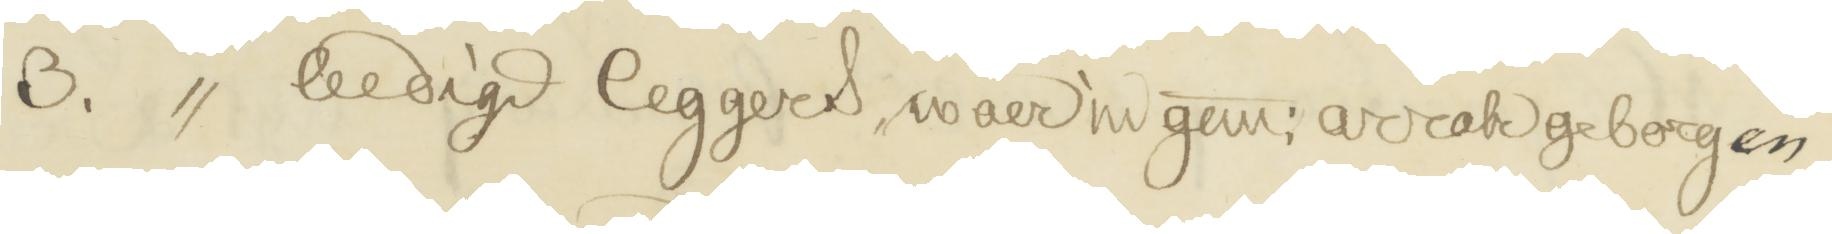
3. „ leedige leggers, waer in gem: arrak geborgen
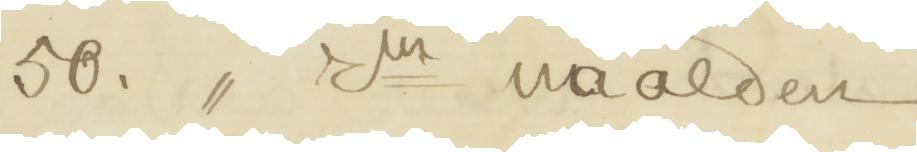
50. „ r=m naalden
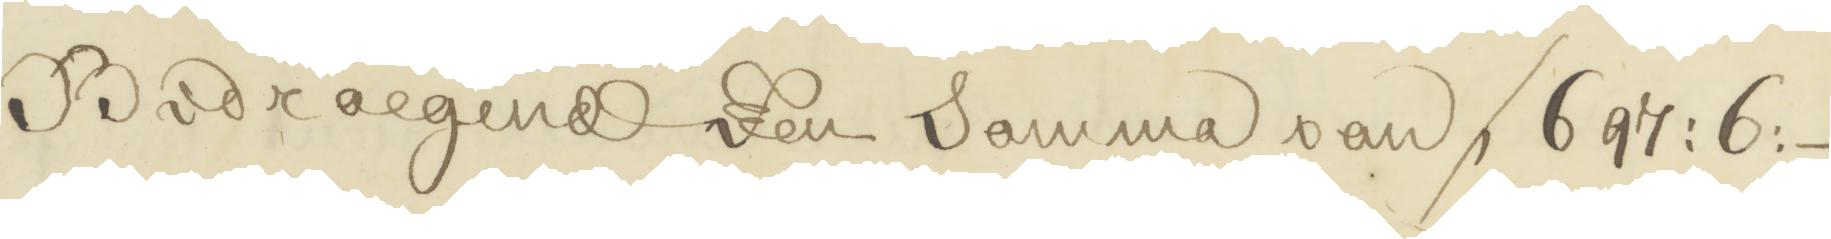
Bedraegende Een somma van ƒ 697:6:-.
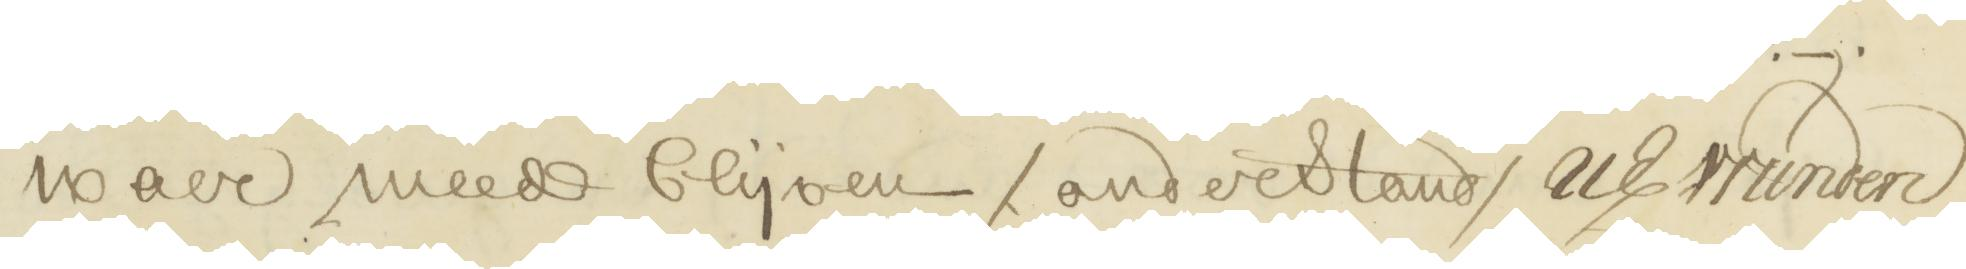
waer meede blijven /onder stand/ UE vrunden
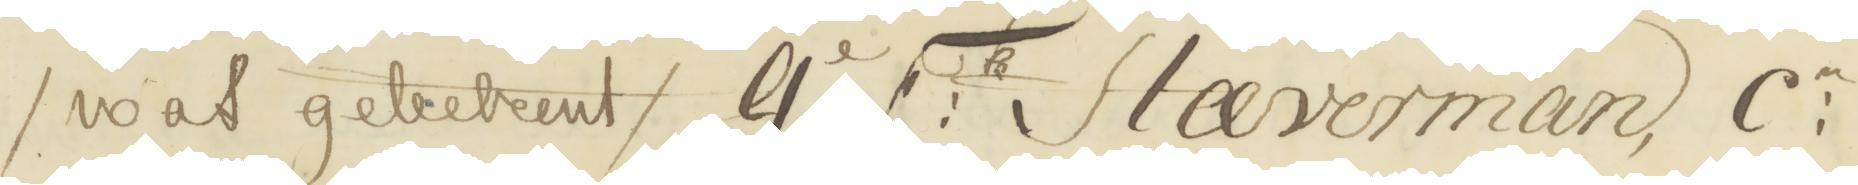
/was geteekent/ G:e F:k Haverman, C:n
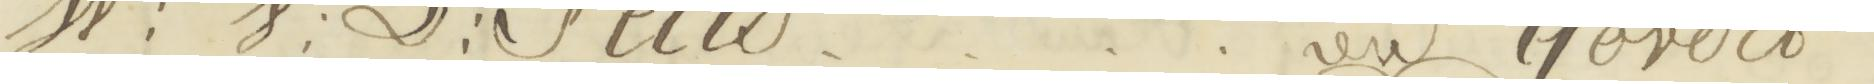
W:m V:n D:r Felts . . . . en Govert
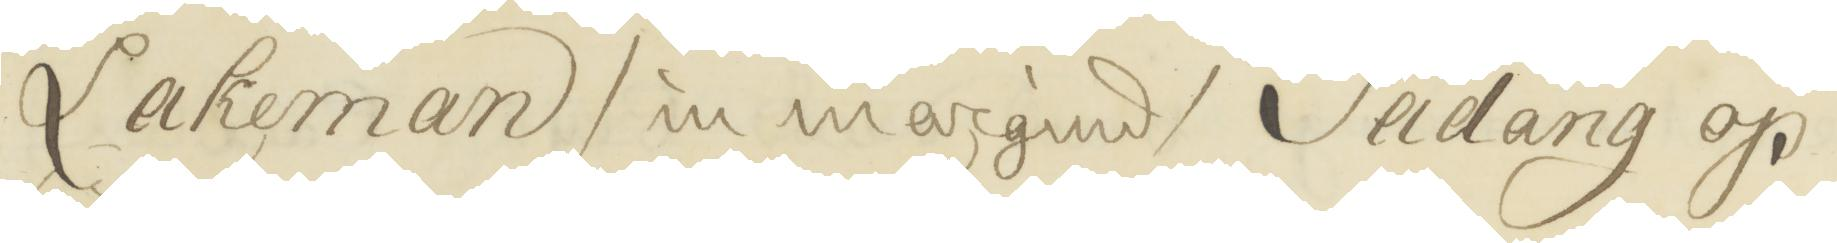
Lakeman /in margine/ Padang op
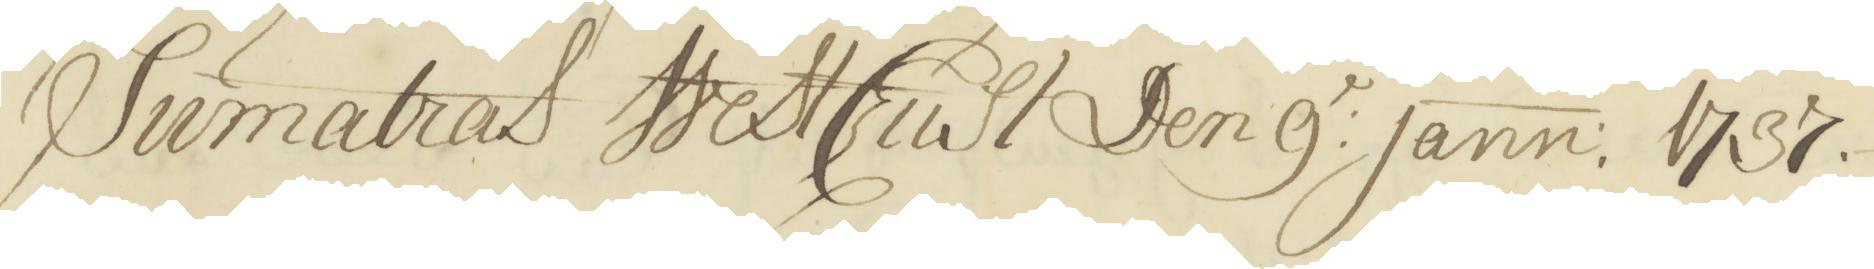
Sumatras West Cust Den 9:e Jann: 1737.
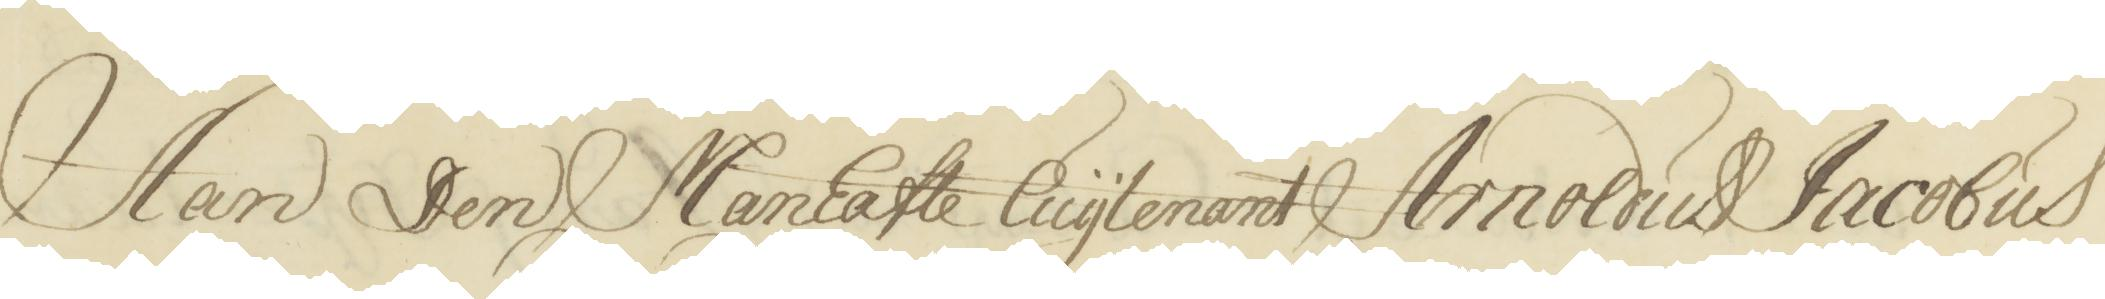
Aan Den Manhafte luijtenant Arnoldus Jacobus
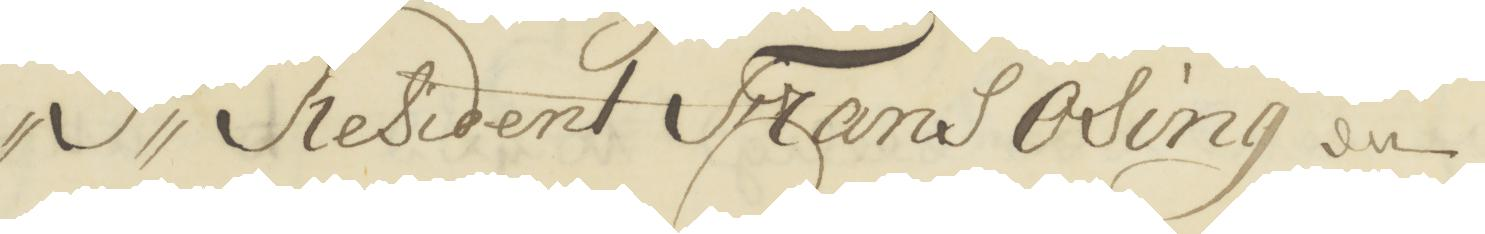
„ „P„e Resident Frans Osing en
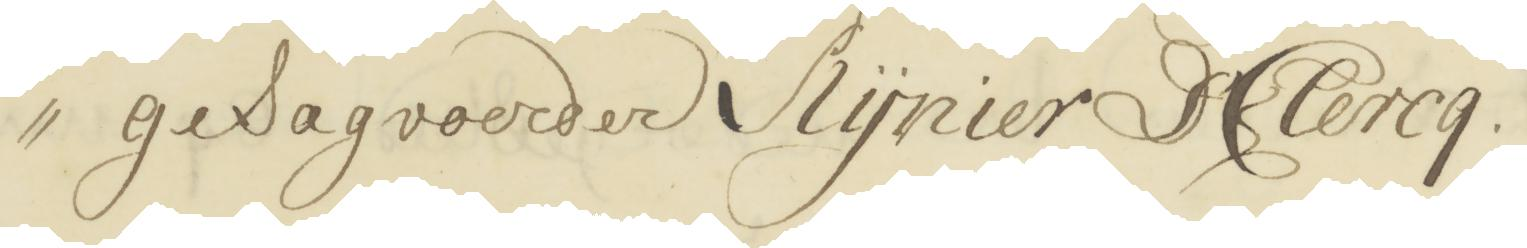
„ gesagvoerder Rijnier D' Clercq.
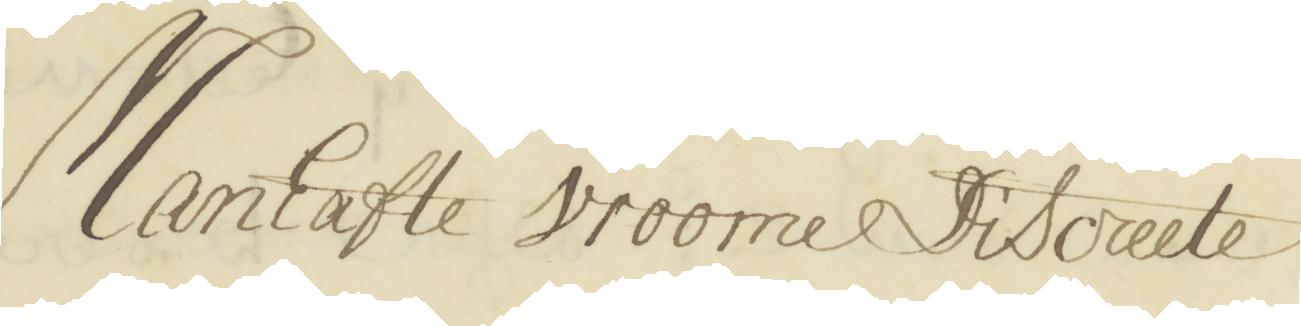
Manhafte vroome Discreete
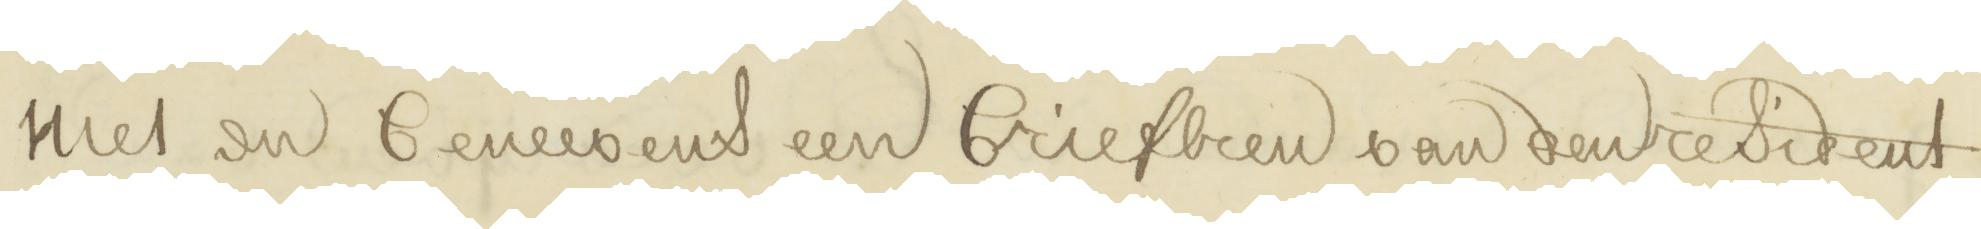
Met en beneevens een briefken van den resident
